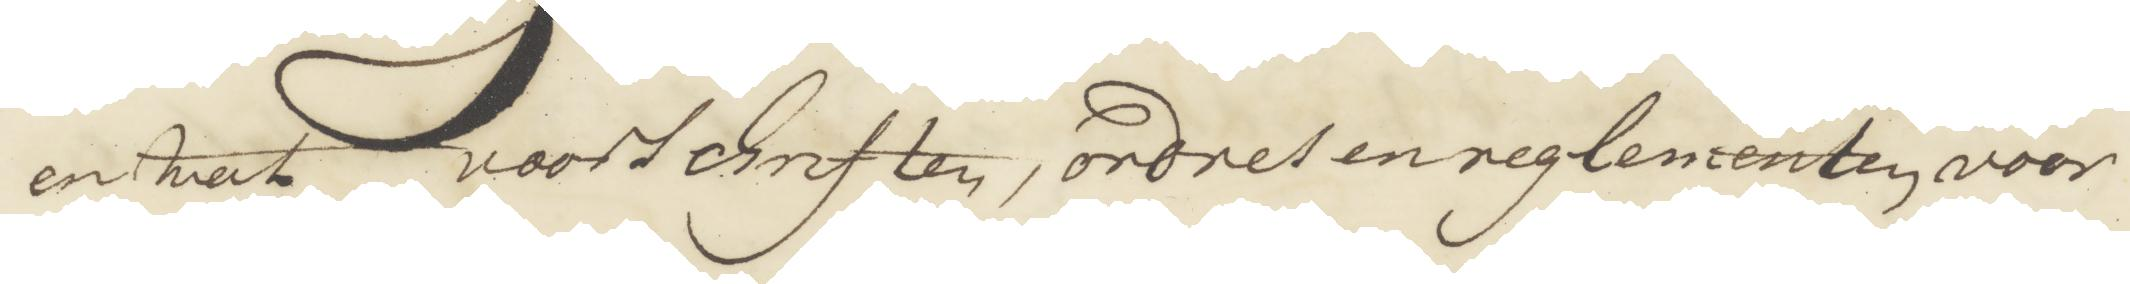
en met voorschriften, ordres en reglementen voor
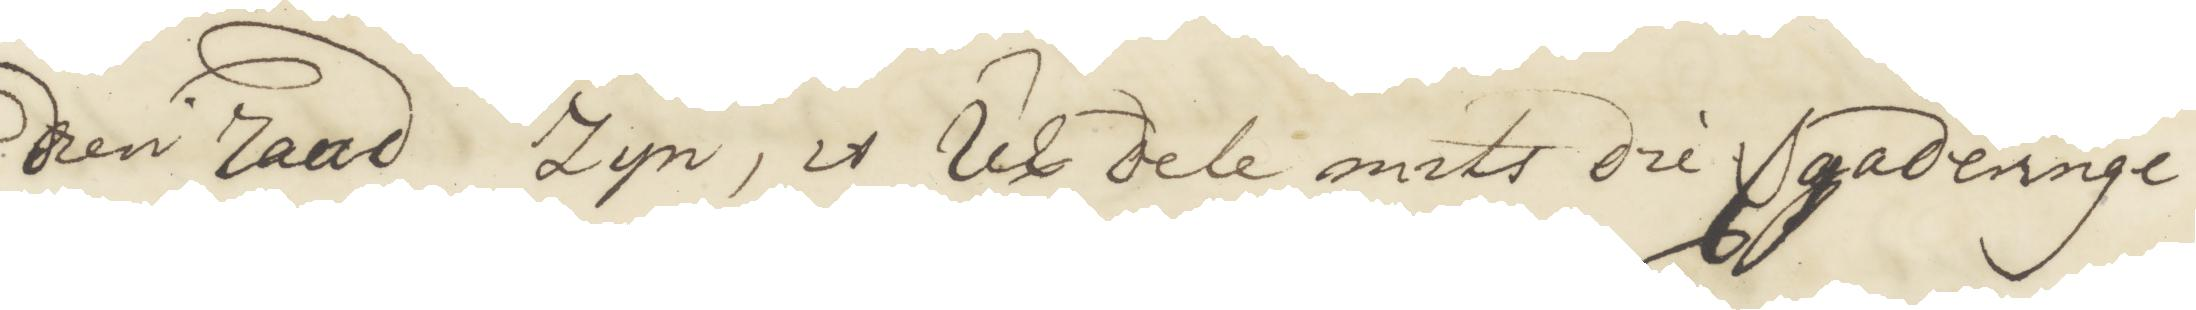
dien raad zijn, is UE dele mits die vergaderinge
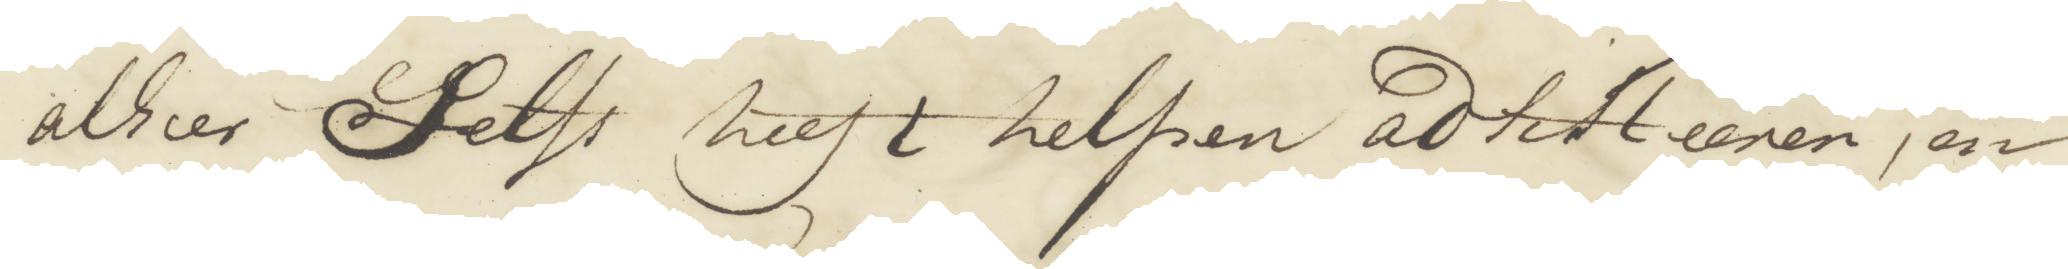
alhier selfs heeft helpen adsisteeren, en
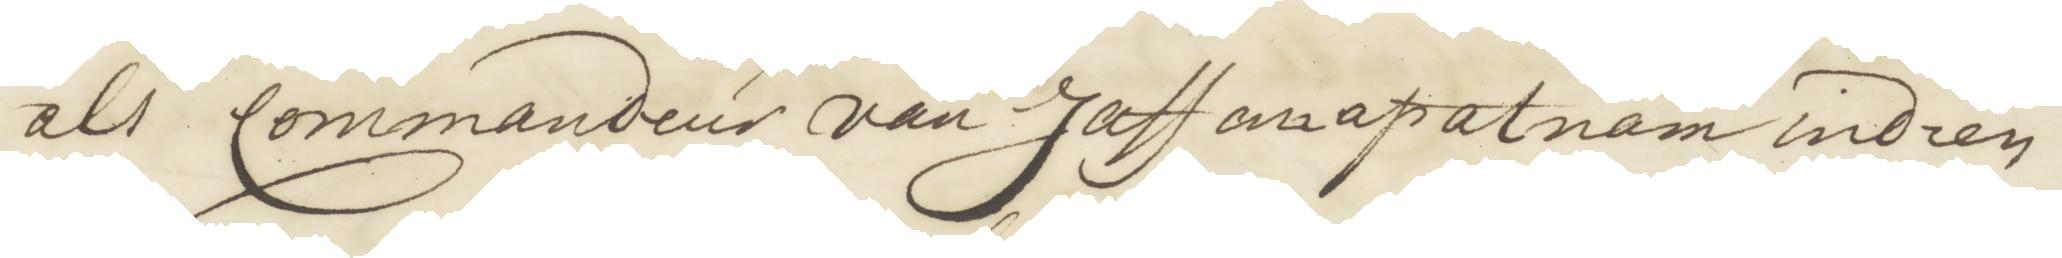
als Commandeur van Jaffanapatnam indien
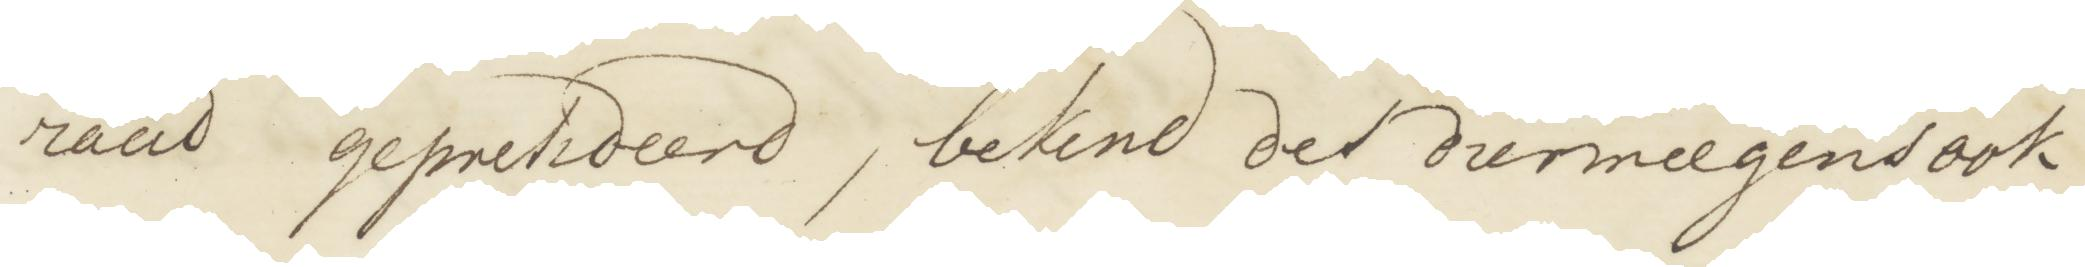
raad gepresideerd, bekend des dierweegens ook
